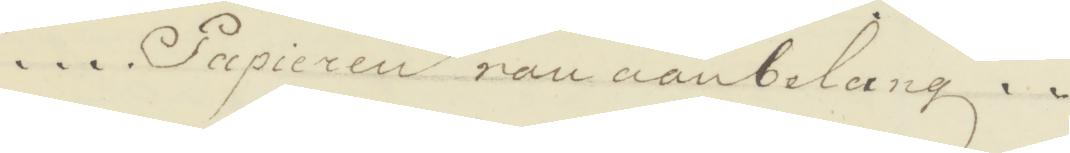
. . . . . . . . . . . Papieren van aanbelang . . . . . . . . . .
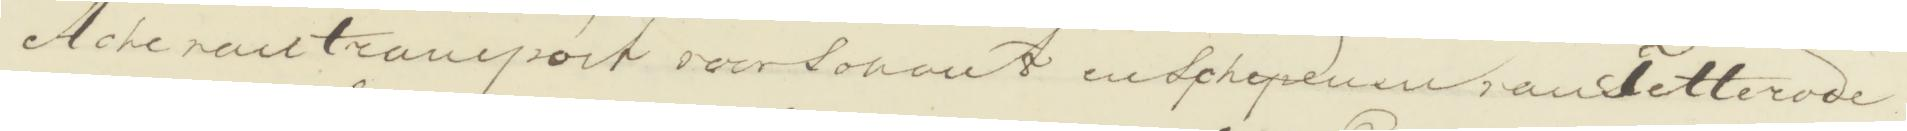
Acte van transport voor schout en schepenen van Tetterode
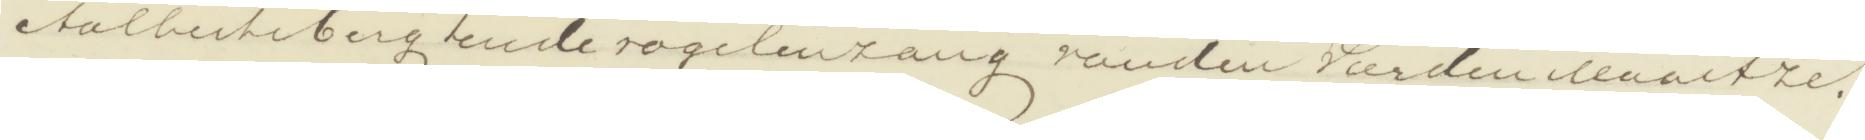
Aalbertsberg ende vogelenzang van den Vierden maart ze.
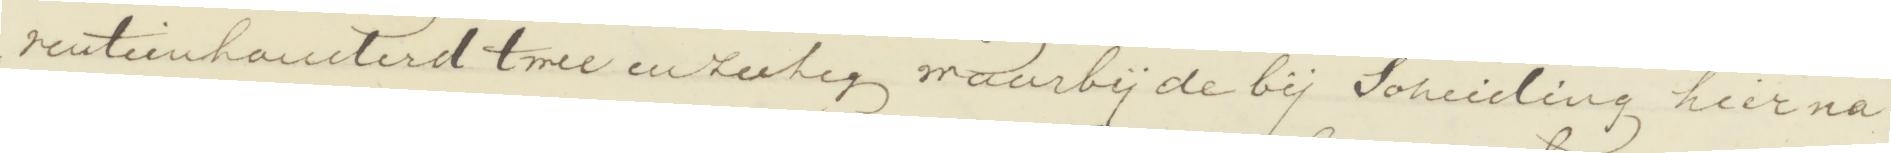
=ventienhonderd twee en zestig waarbij de bij scheiding hierna
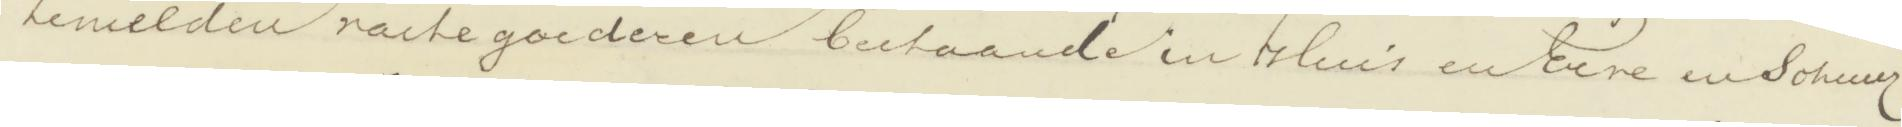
temelden vaste goederen bestaande in Huis en Erve en schuur
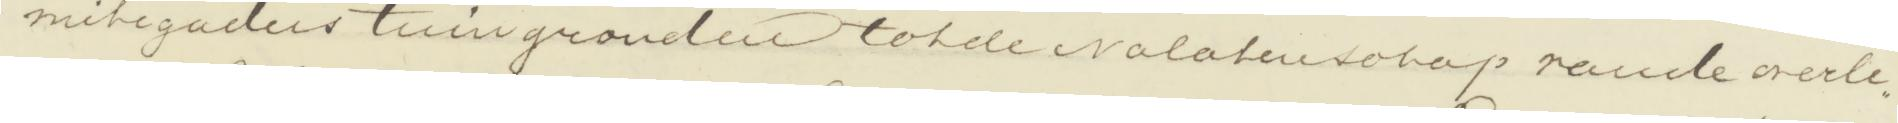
mitsgaders tuingronden tot de Nalatenschap vande overle„
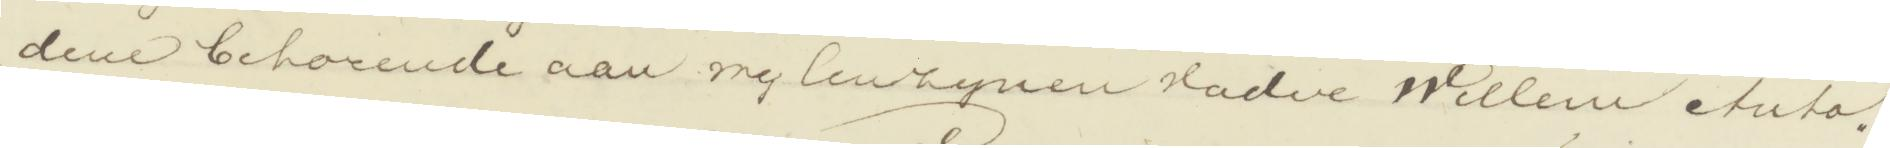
=dene behorende aan wylen zynen vader Willem Anto„
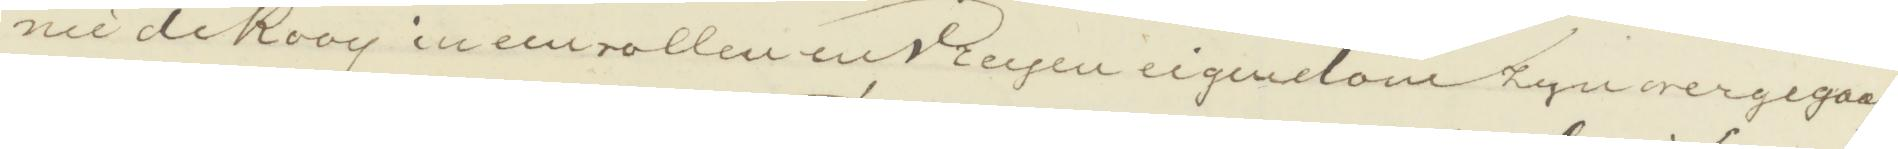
nie de Rooy in een vollen en Vreyen eigendom zyn overgegaan
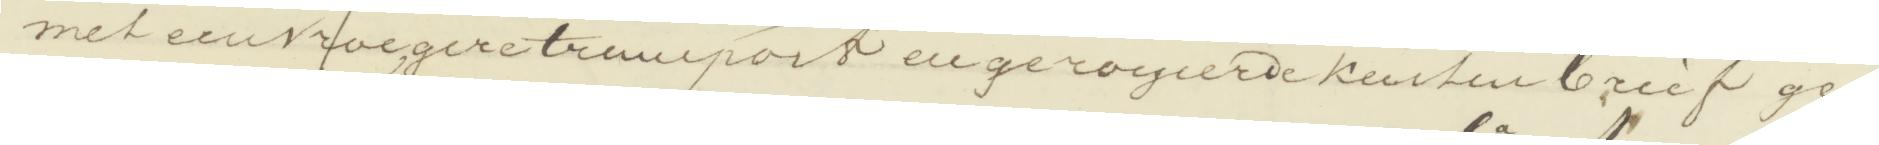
met een vroegere transport en geroyeerde kosten brief ge.
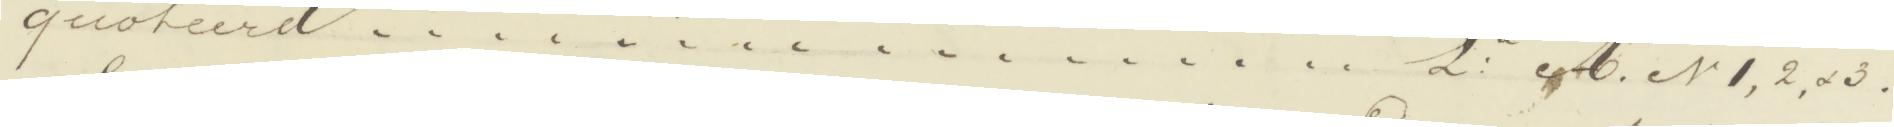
quoteerd . . . . . . . . . . . . . . . . . . . L:a A. N1, 2, & 3.
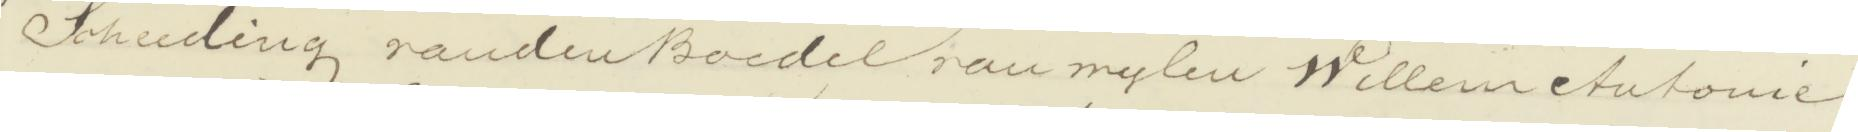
Scheiding van den Boedel van wylen Willem Antonie
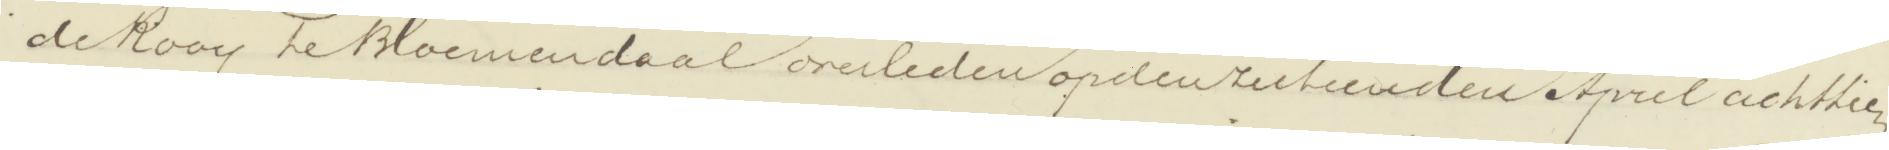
de Rooy te Bloemendaal overleden opden zestienden April achttien
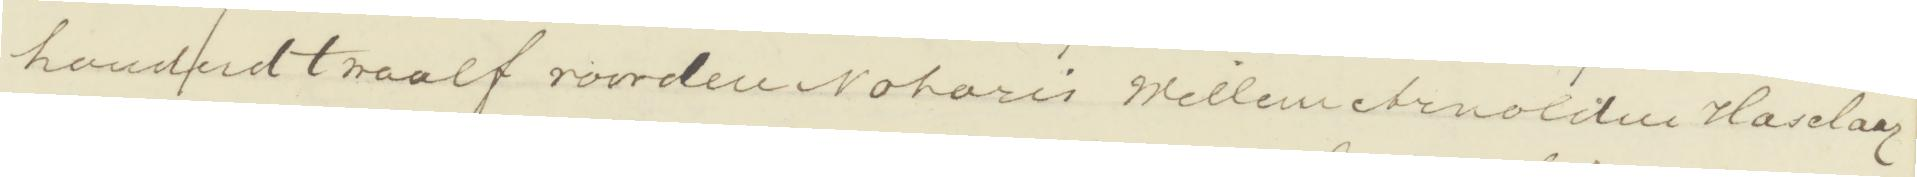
honderd twaalf voor deze Notaris Willem Arnoldus Haselaar
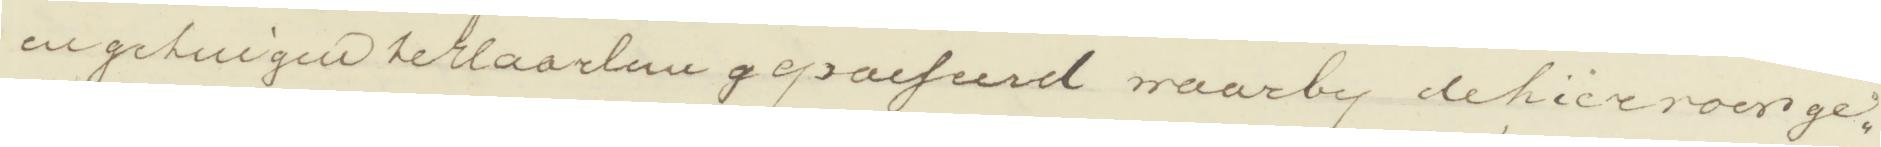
en getuigen te Haarlem gepasseerd waarby de hier voor ge„
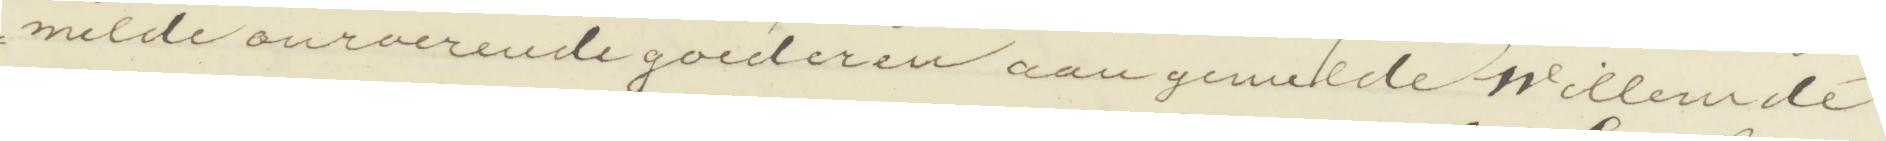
=melde onroerende goederen aan gemelde Willem de
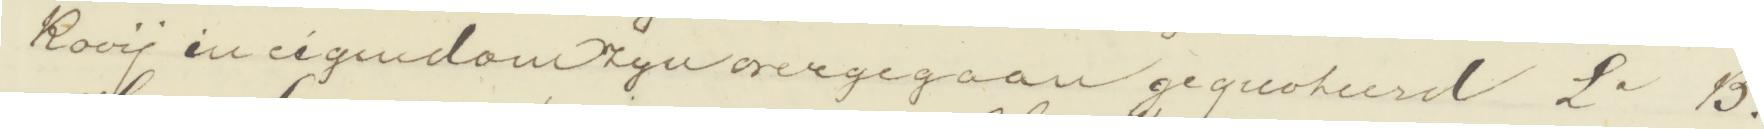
Rooij in eigendom zyn overgegaan gequoteerd La B.
